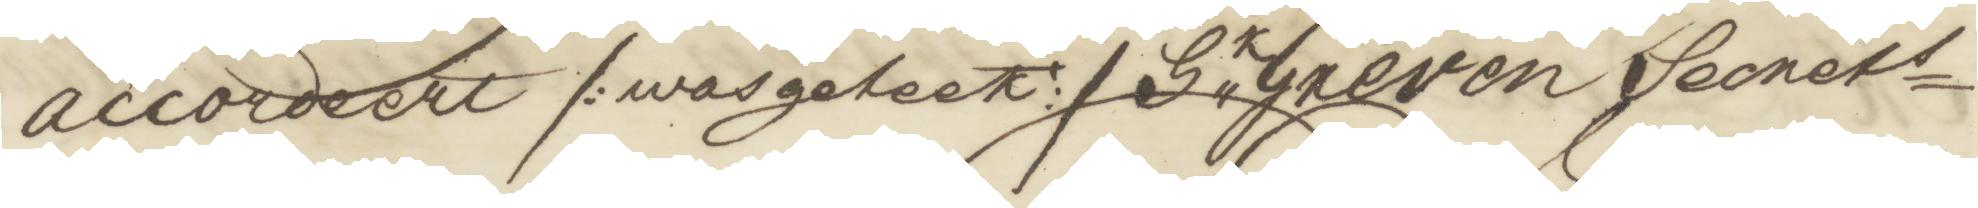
accordeert /:was geteek:t/ h„k Greven secret=s
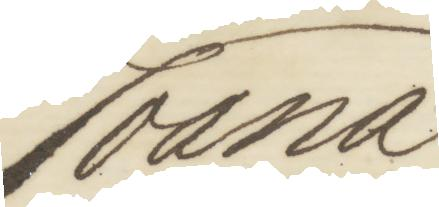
Ioana
